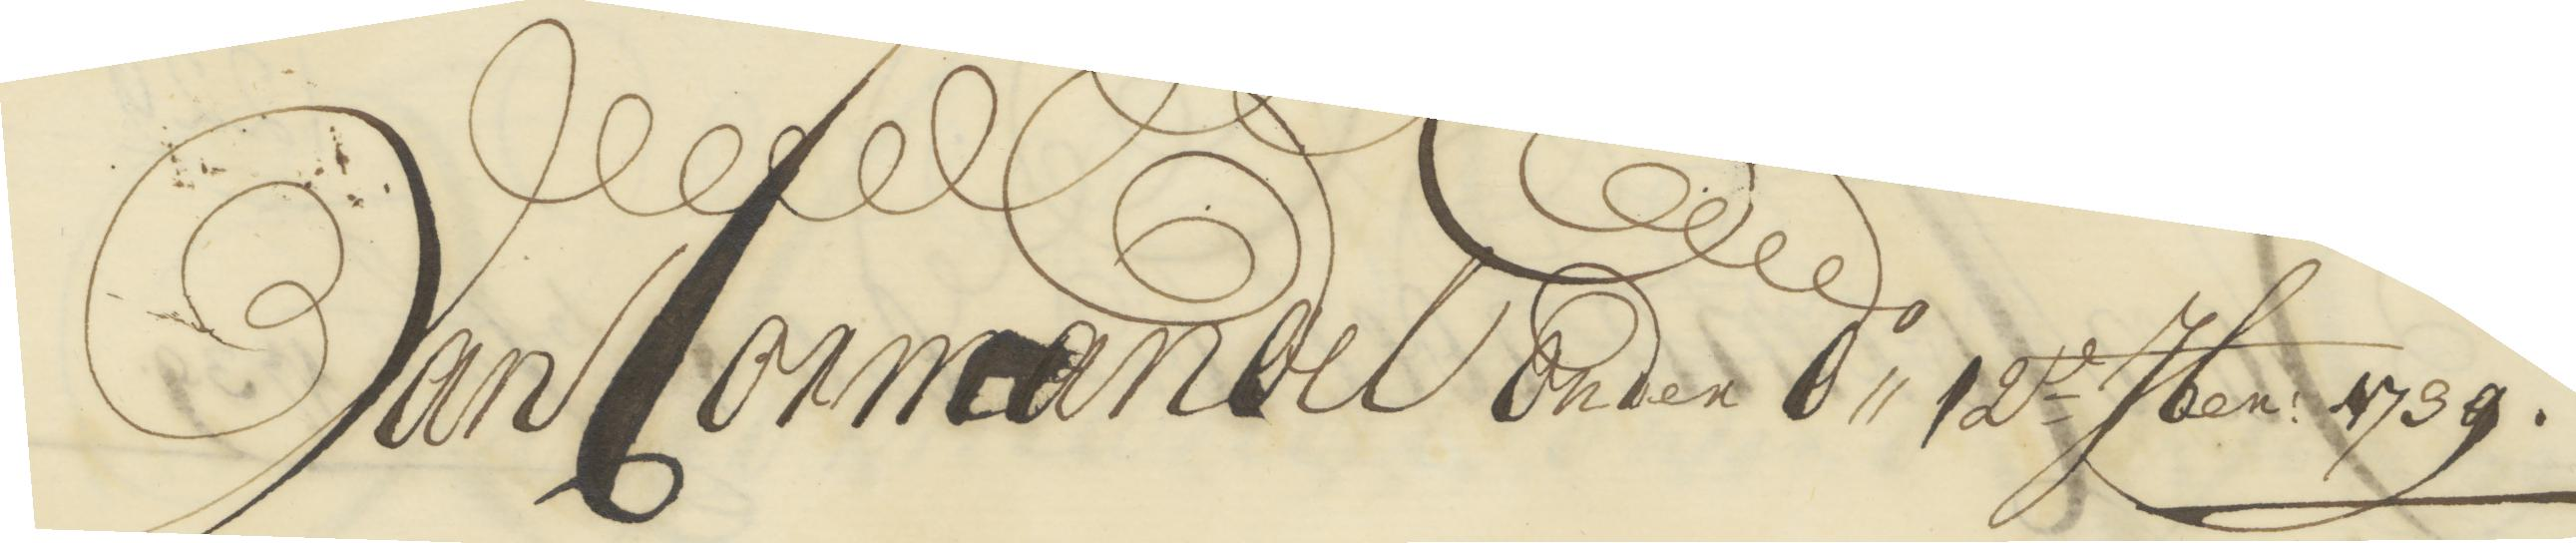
Van Cormandel onder d„o 12=e 7ber: 1739.
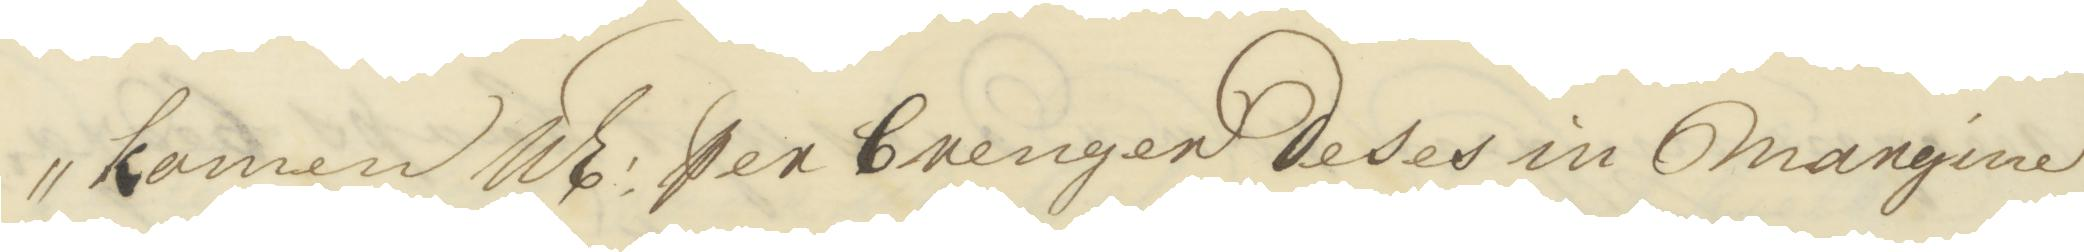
„komen UE: per brenger deses in margine
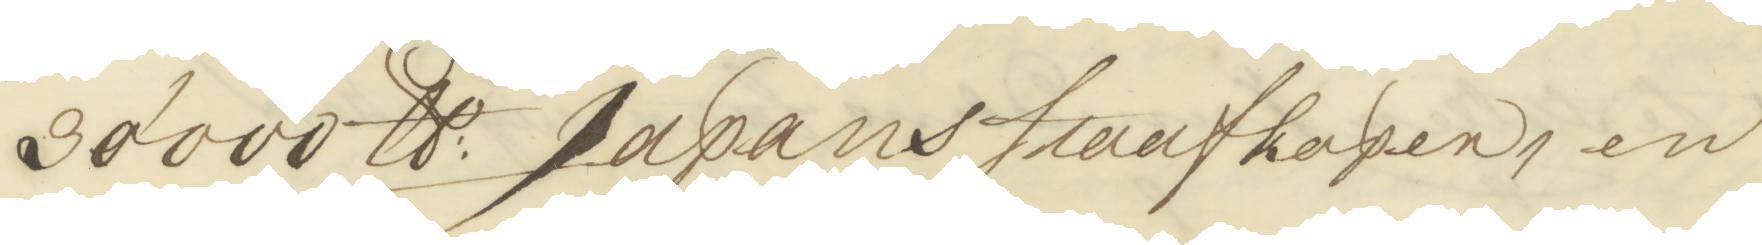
30'000 lb: Japans Staafkoper, en
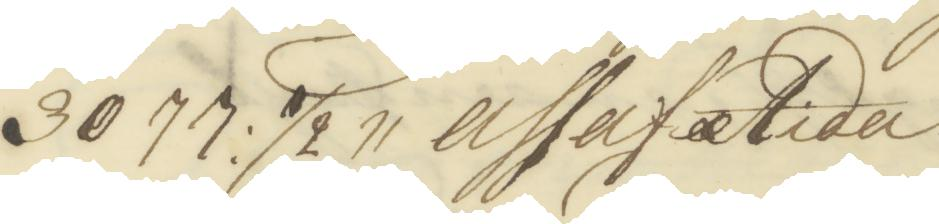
3077: ½ „ assafaetida
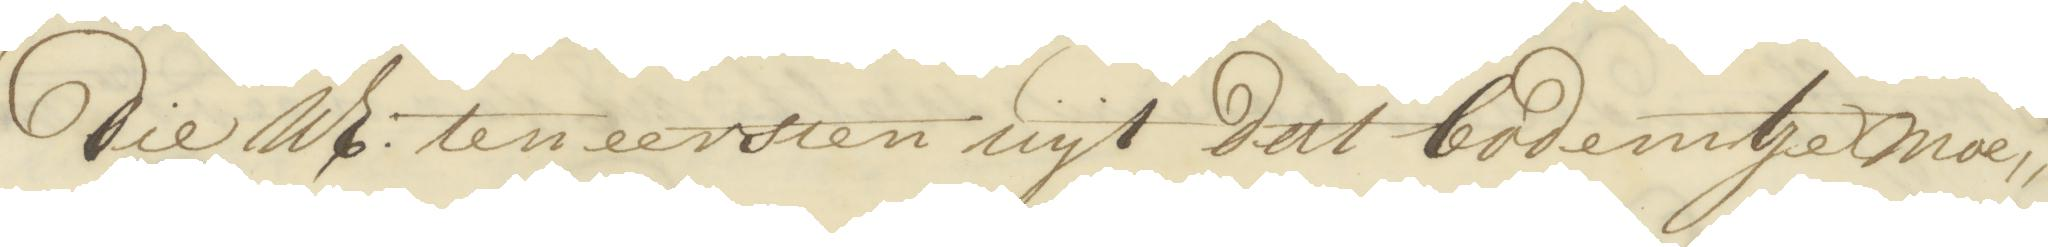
die UE: ten eersten uijt dat bodemtje moe„
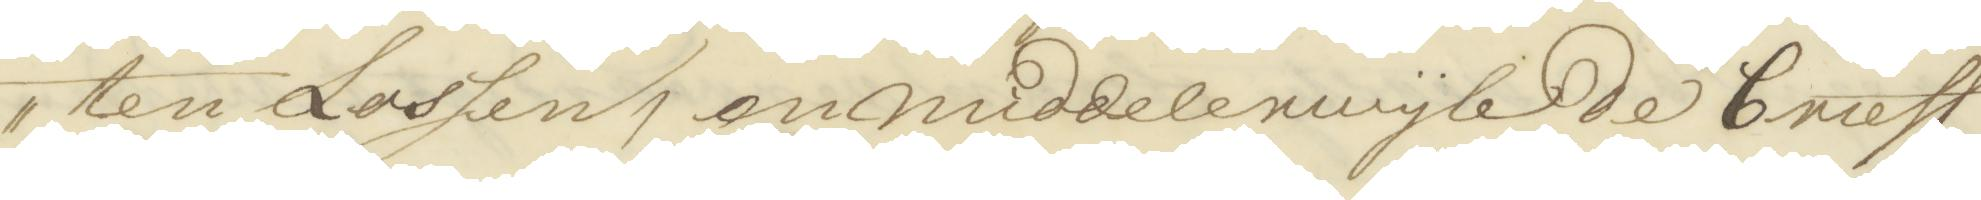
„ten Lossen, en middelerwijle de brieff
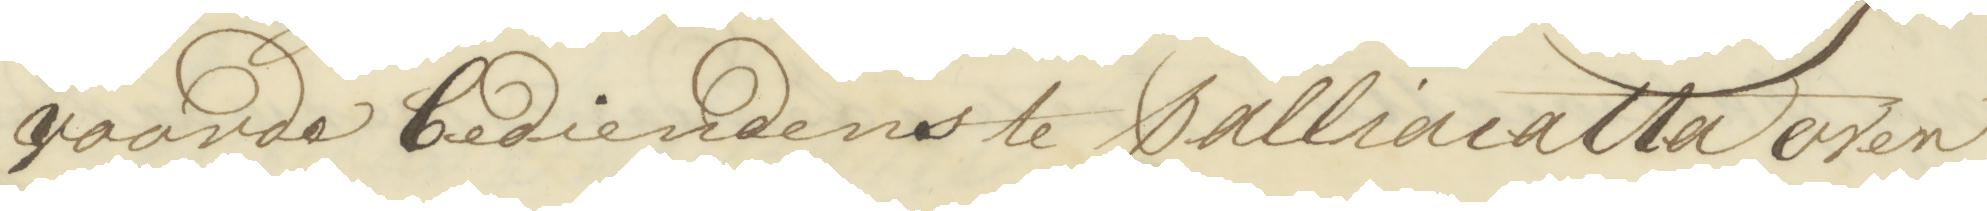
voorde bediendens te palliacatta over
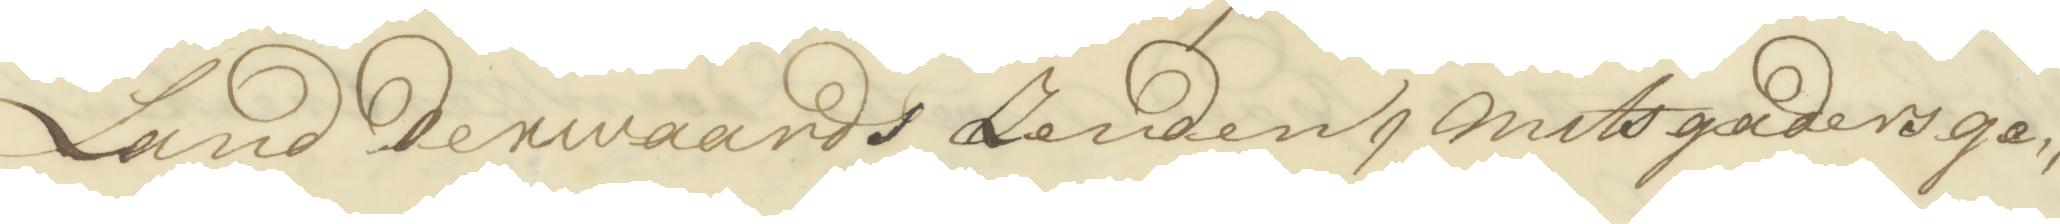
Land derwaards zenden, mitsgaders ge„
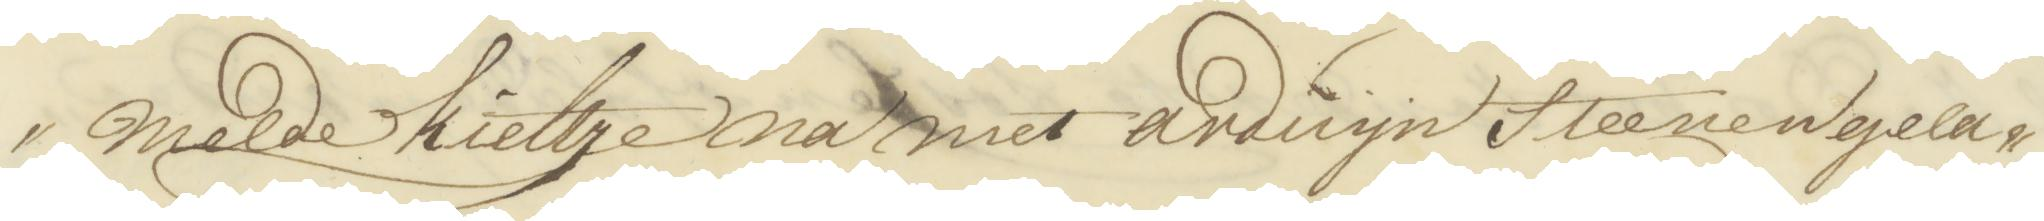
„melde kieltje na met arduijn steenen gela„
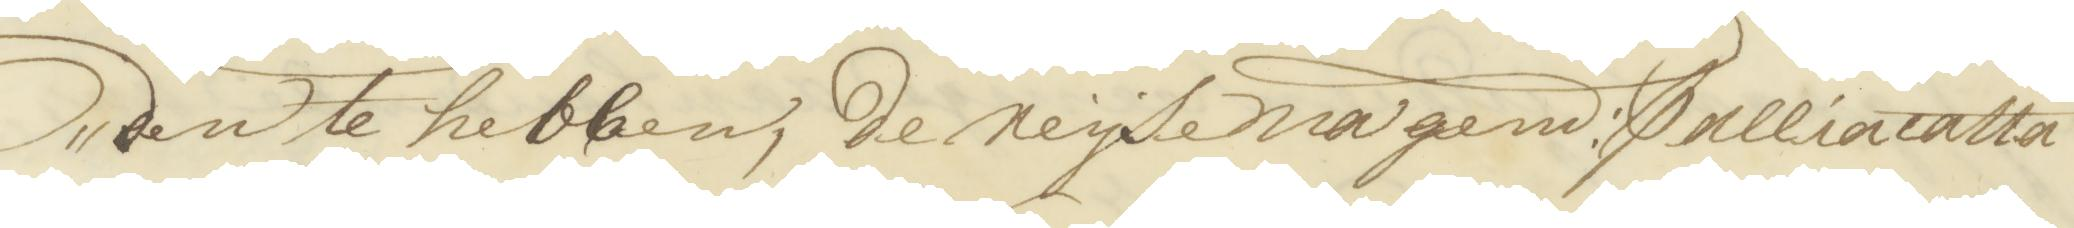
„den te hebben, de reijse na gem: palliacatta
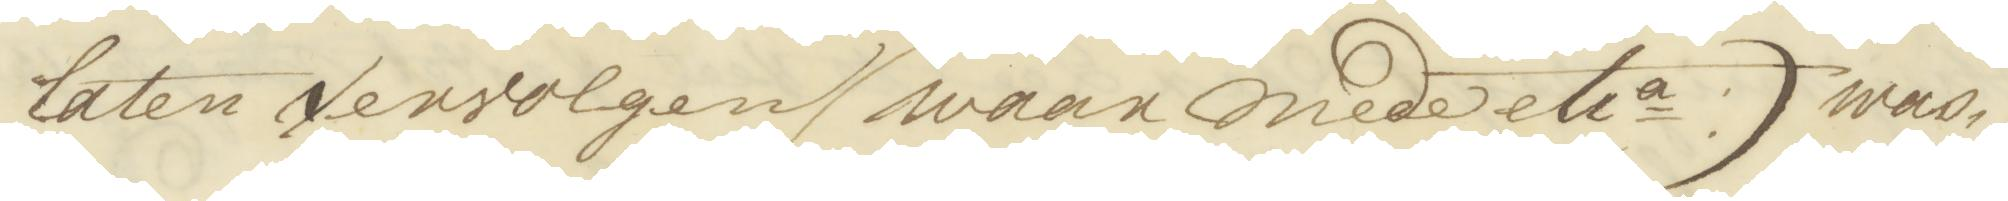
laten vervolgen (waar mede etc=a :) was„
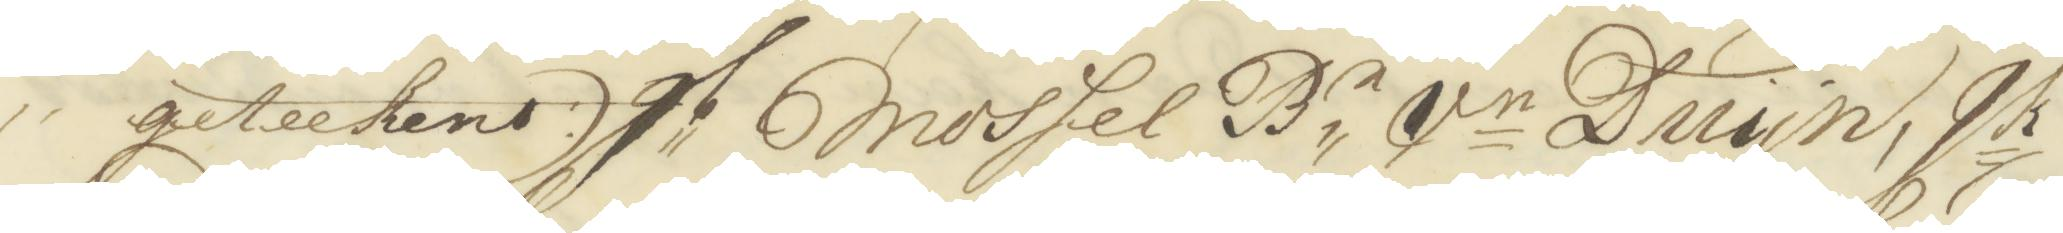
„geteekent :) J:b mossel B„r V=n Duijn, J=k
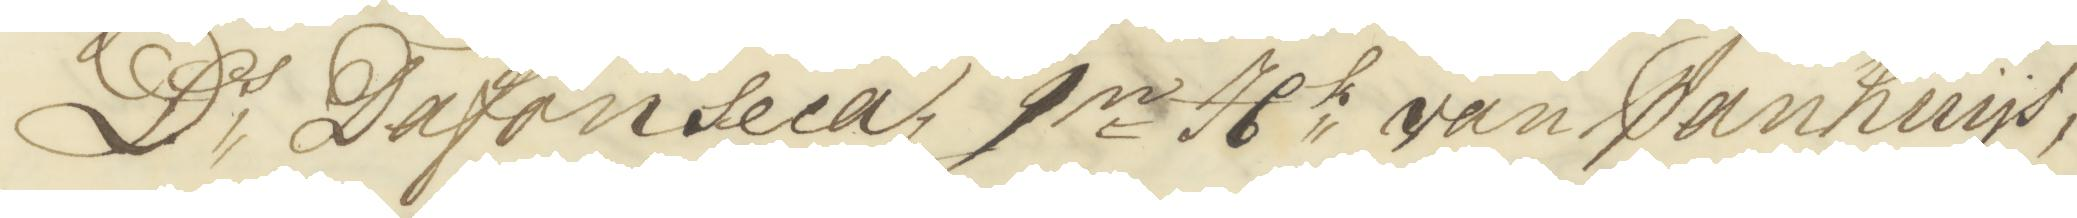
D„s Dafonseca, J=n H„k van panhuijs,
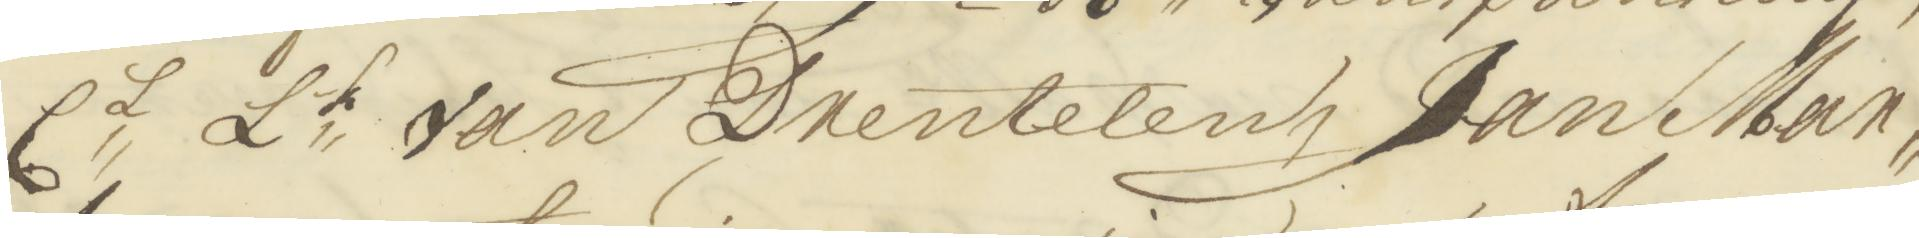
C„l L„k van Drentelen, Jan Mar„
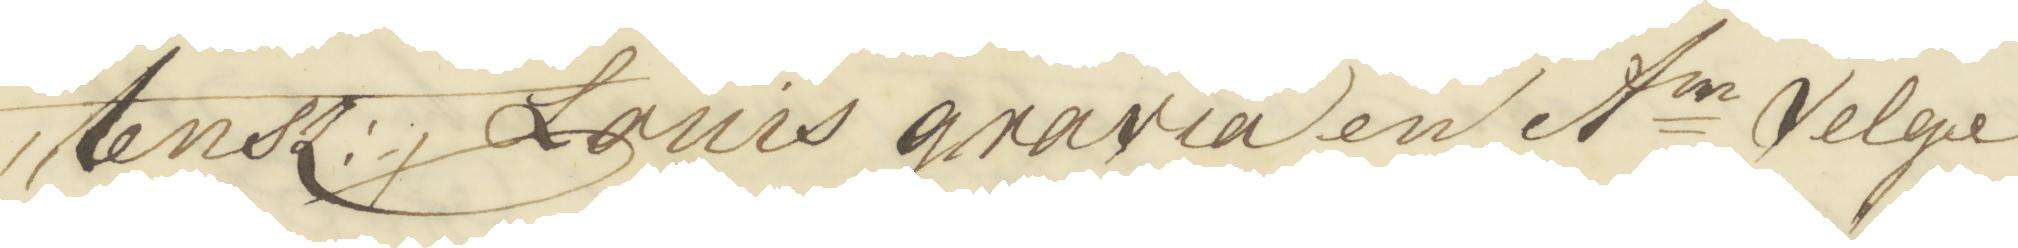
„tensz:, Louis gravia en A=m Velge
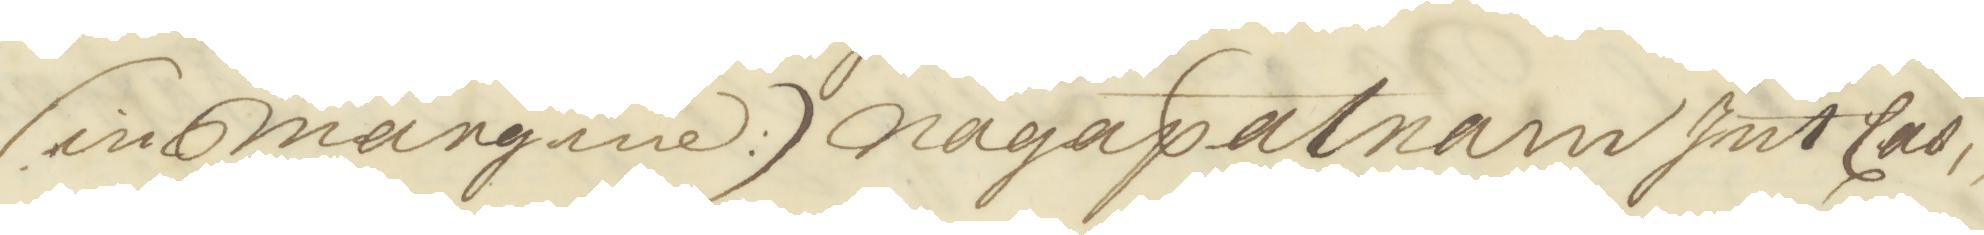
(:in margine:) nagapatnam Jnt Cas„
